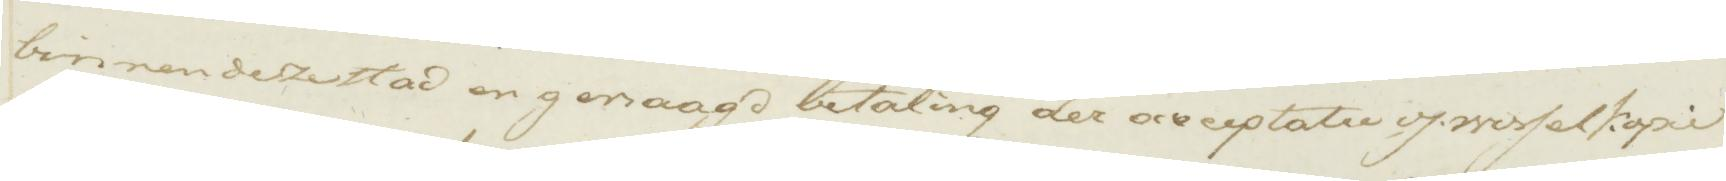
binnen deze stad en gevraagd betaling der acceptatie of wisselkopie
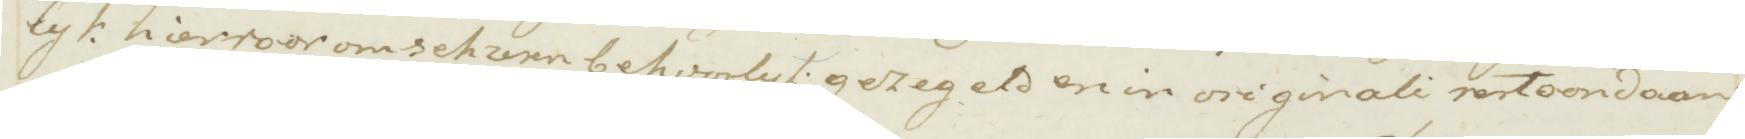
lyk hiervoor omschreven behoorlyk gezegeld en in originali vertoond aan
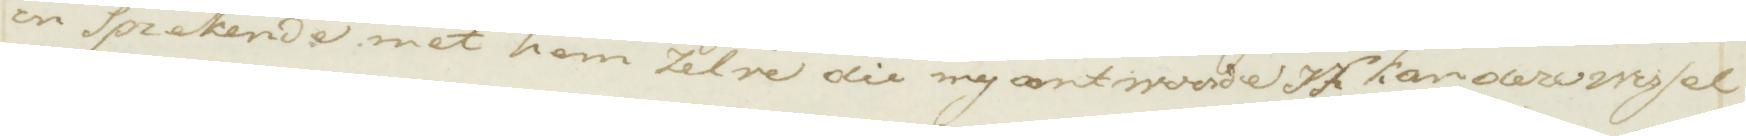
en sprekende met hem zelve die my antwoorde Jk kan deze wissel
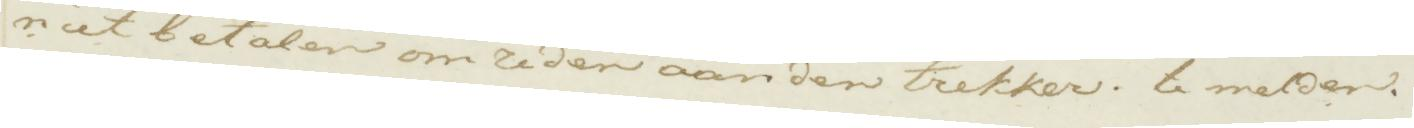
niet betalen om reden aan den trekker. te melden.
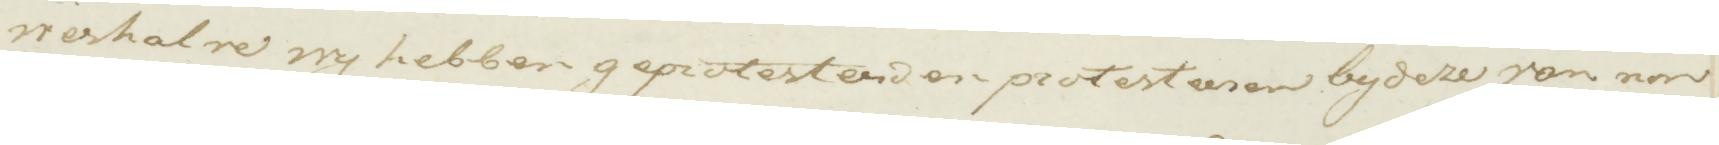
Weshalve wy hebben geprotesteerd en protesteeren by deze van non
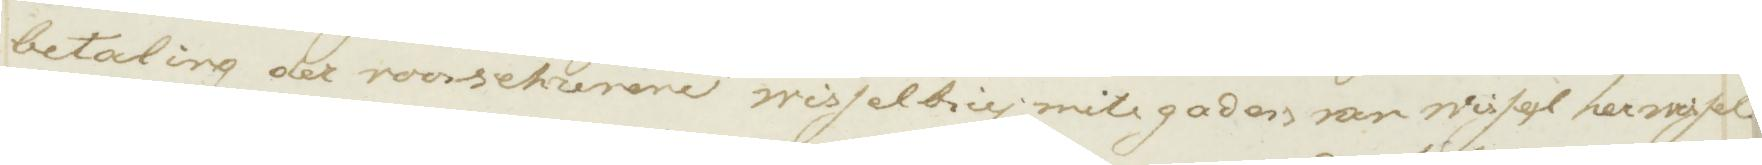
betaling der voorschrevene wisselbrief mitsgaders van wissel & herwissel
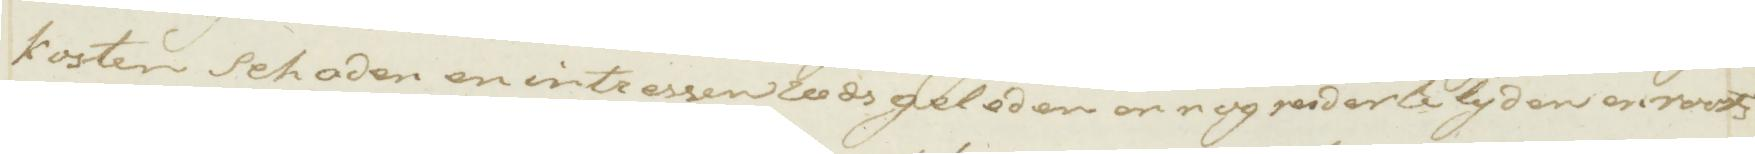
kosten schaden en intressen reeds geleden en nog verder te lyden en voorts
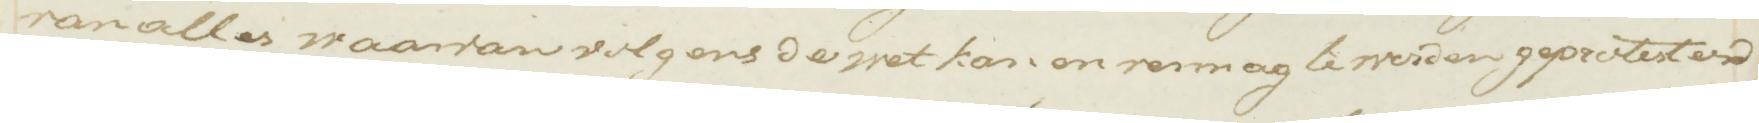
van alles waarvan volgens de wet kan en vermag te werden geprotesteerd
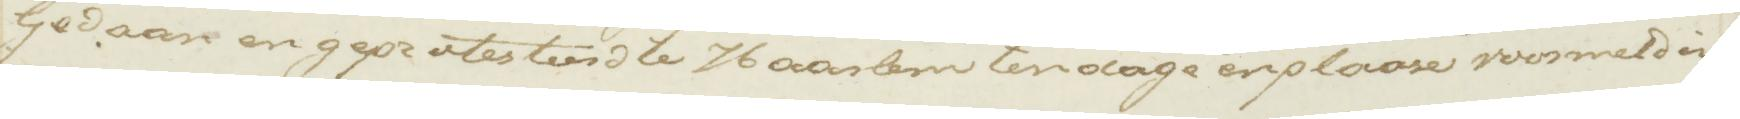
Gedaan en geprotesteerd te Haarlem ten dage en plaase voormeld in
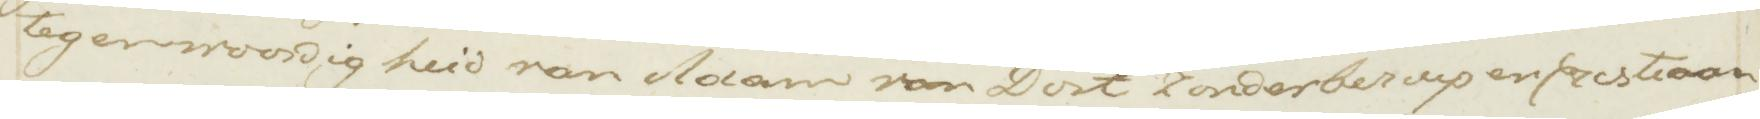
tegenwoordigheid van Adam van Dort zonder beroep en Cristiaan
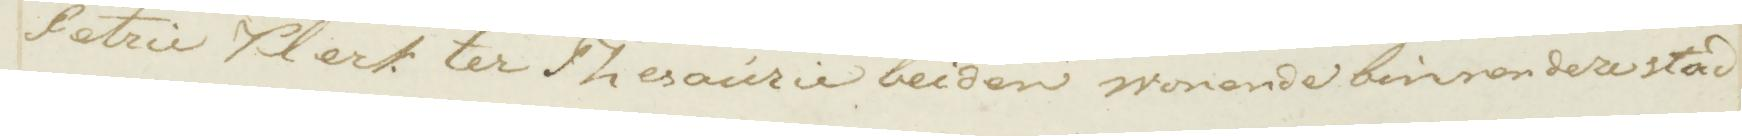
Petrie Klerk ter Thesaurie beiden wonende binnen deze stad
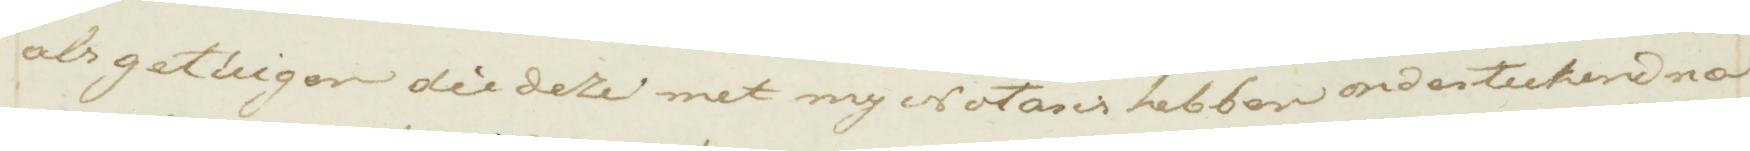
als getuigen die deze met my Notaris hebben onderteekend na
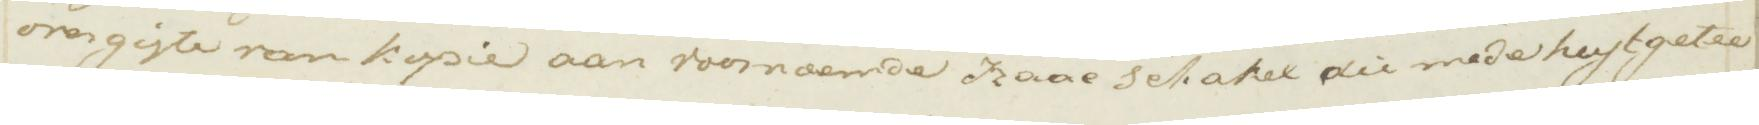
overgifte van kopie aan voornoemde Jzaac schakel die mede heeft getee
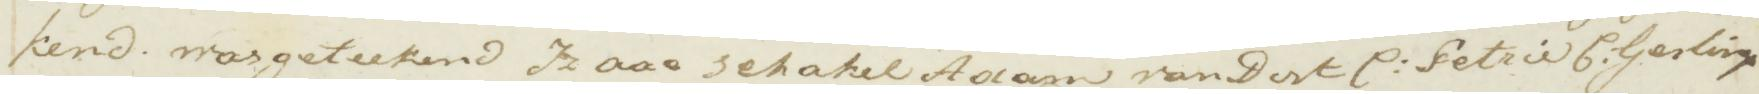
kend. was geteekend Izaac schakel Adam van Dort C: Petrie C: Gerlings
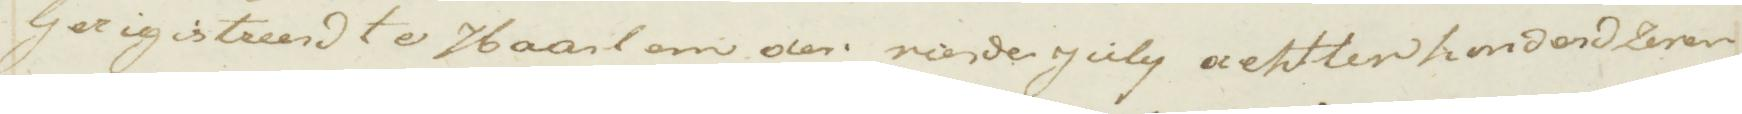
Gerigisteeerd te Haarlem der vierde July achtten honderd zeven
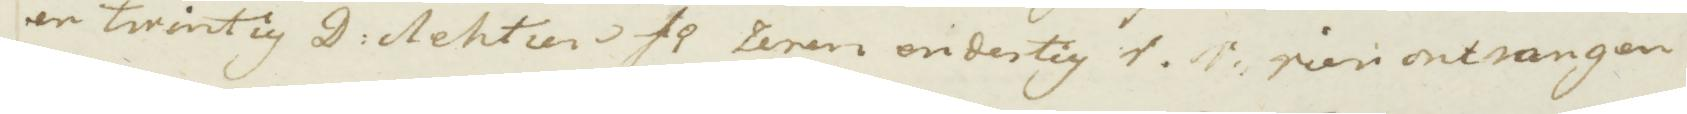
en twintig D: Achtien f.o zeven en dertig v. v. vier ontvangen
